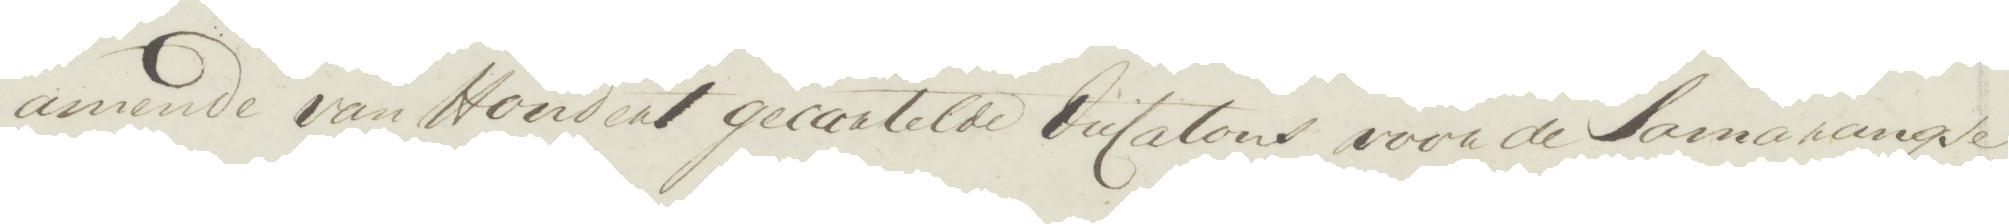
amende van Hondert gecartelde Ducatons voor de samarangse
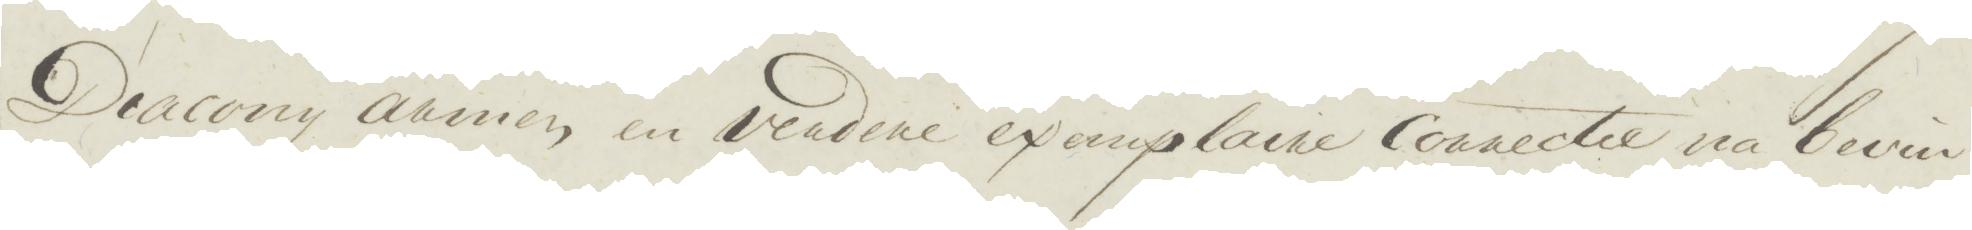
Diacony armen en verdere exemplaire correctie na bevin
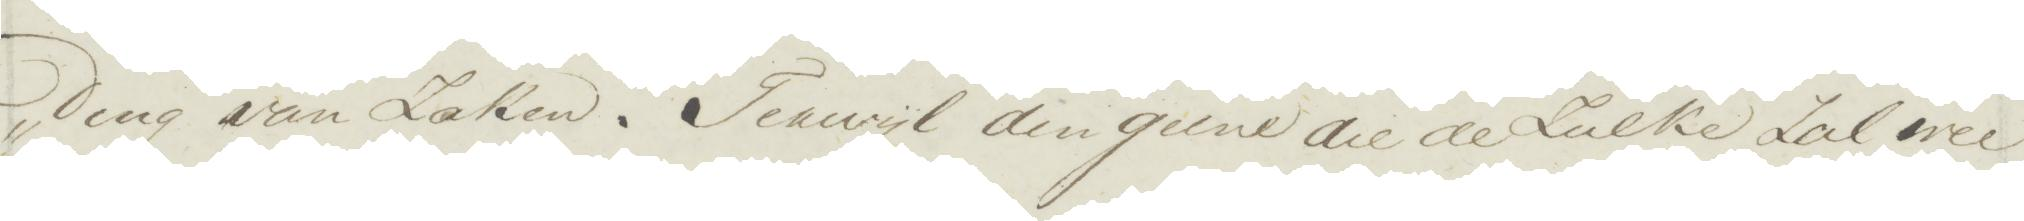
„ding van zaken. Terwijl den geene die de zulke zal wee
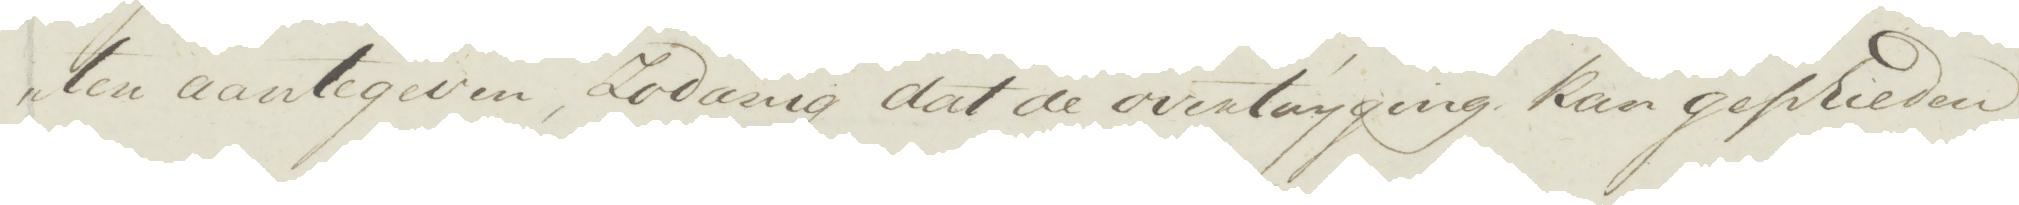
ten aantegeven, zodanig dat de overtuijging kan geschieden
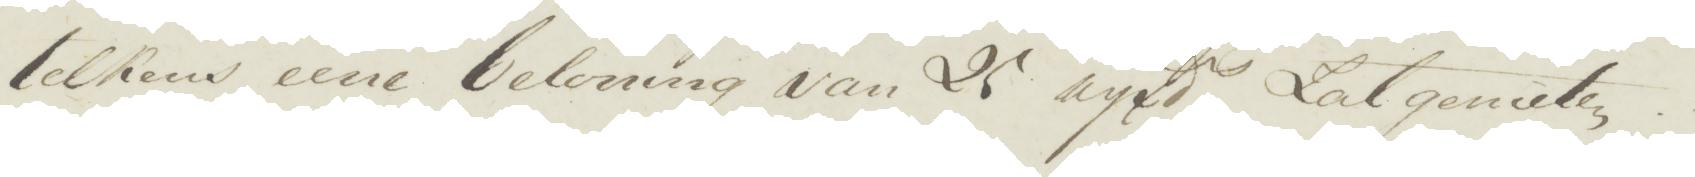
telkens eene beloning van 25: rijxd„s zal gemeten. —
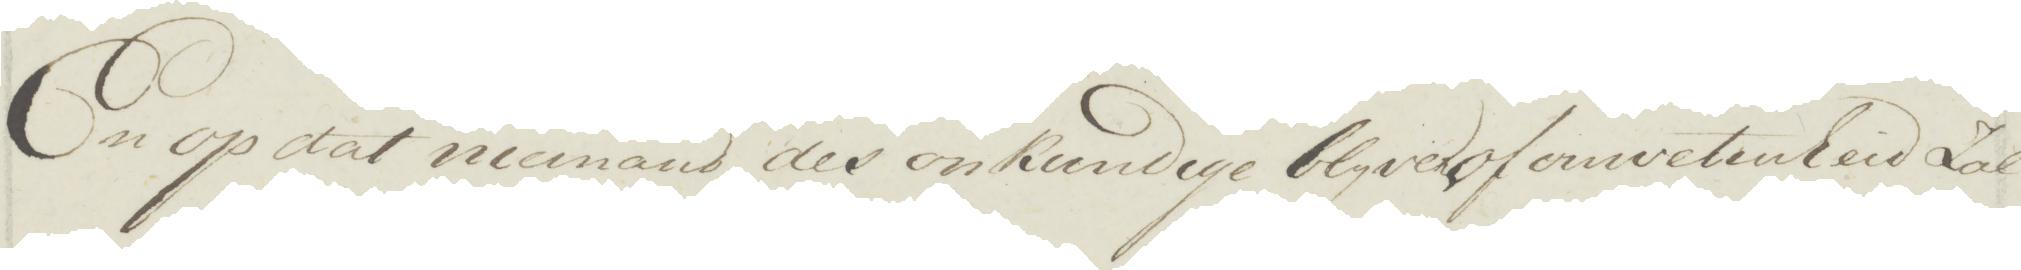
En op dat niemand des onkundige blijven of onwetenheid zal
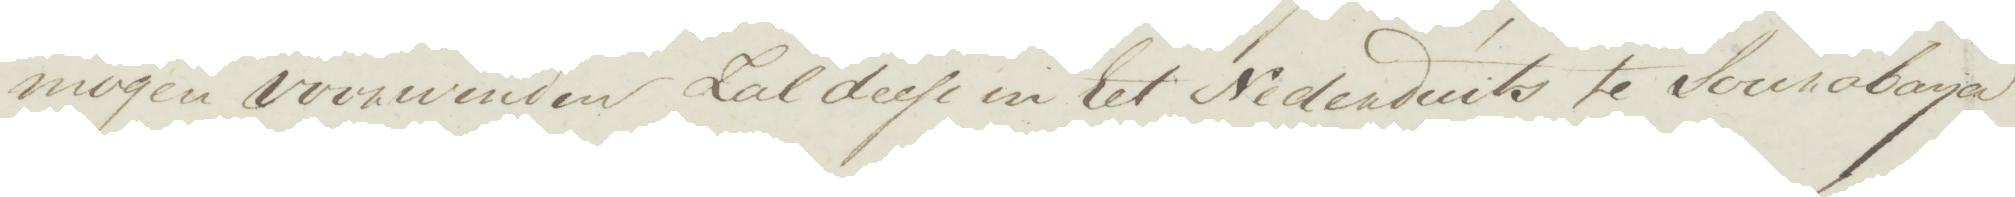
mogen voorwenden zal deese in het Nederduits te sourabaija
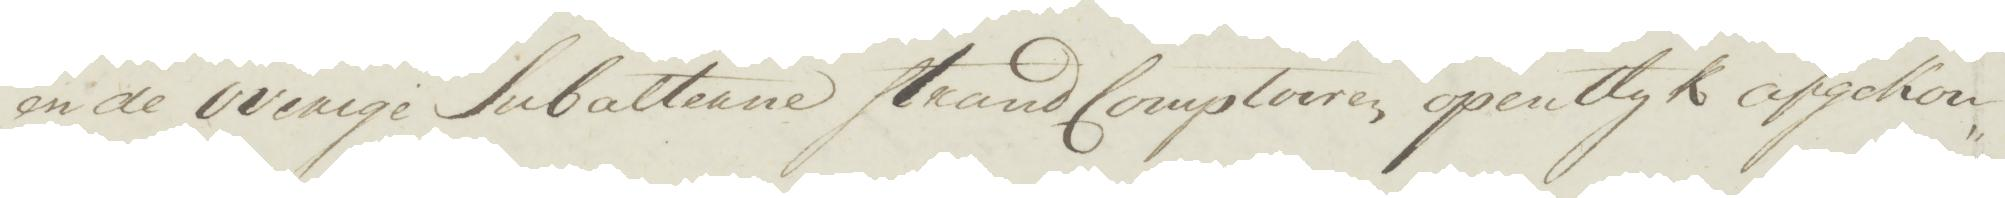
en de overige subalterne strand Comptoiren opentlyk afgekon„
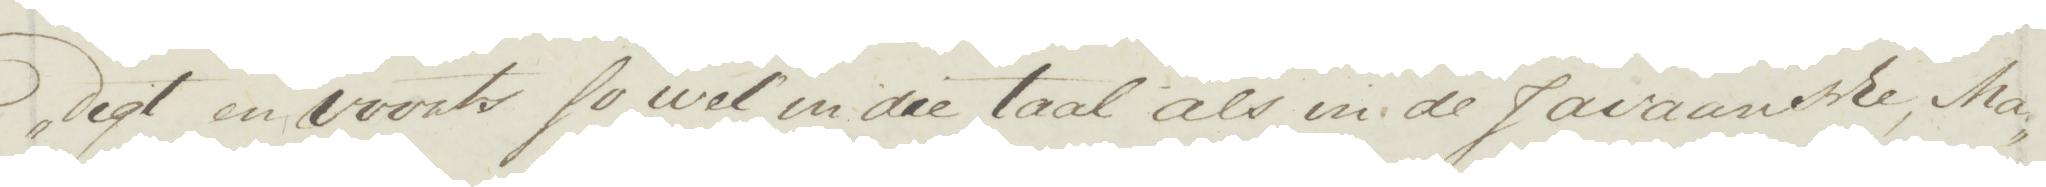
„digt en voorts so wel in die taal als in de Javaansche, Ma„
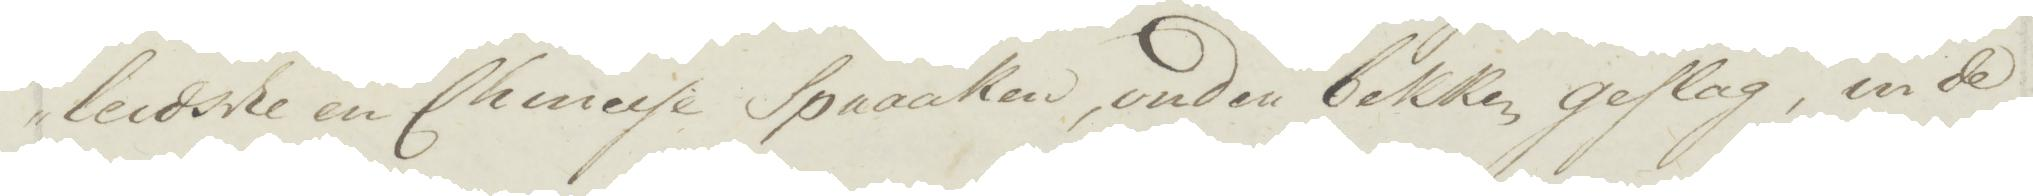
„leidsche en Chineese spraaken, onder bekken geslag, in de
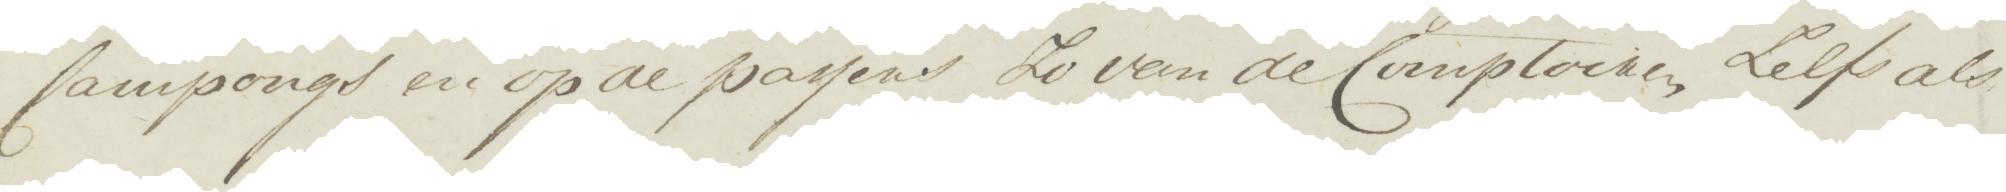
Campongs en op de passers zo van de Comptoiren zelfs als
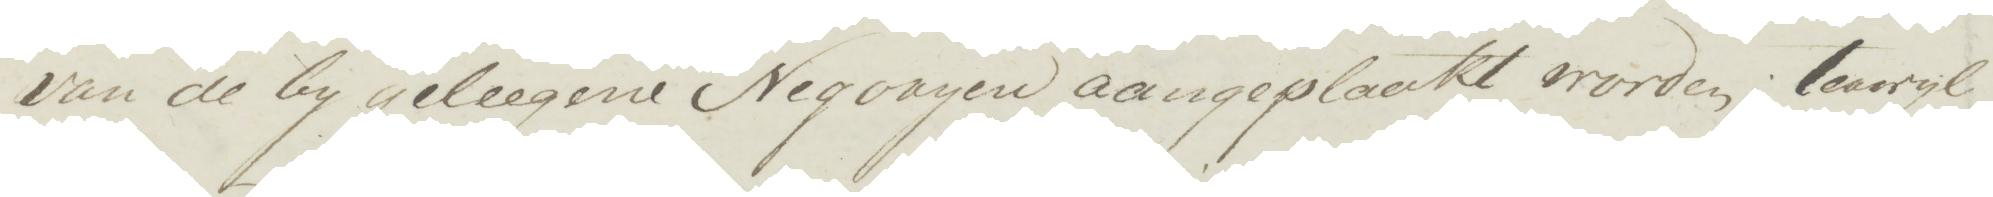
van de by geleegene Negoryen aangeplaakt worden; terwijl
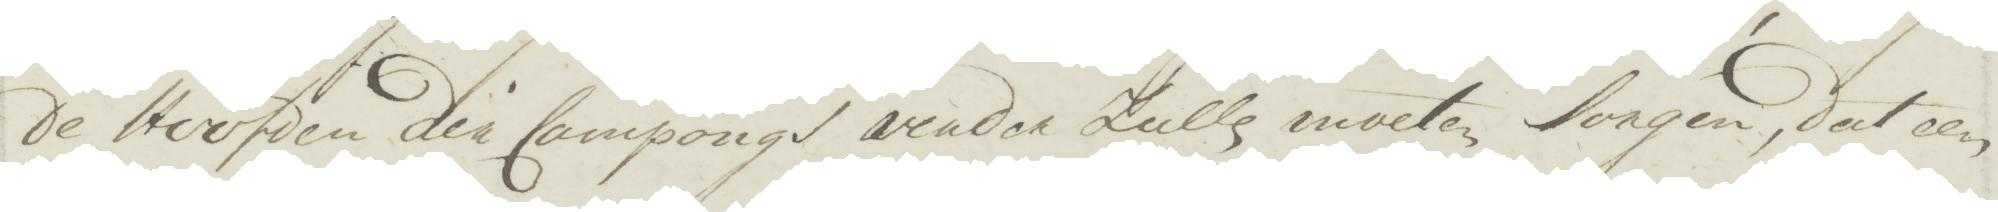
de Hoofden der Campongs verder zullen moeten sorgen, dat een
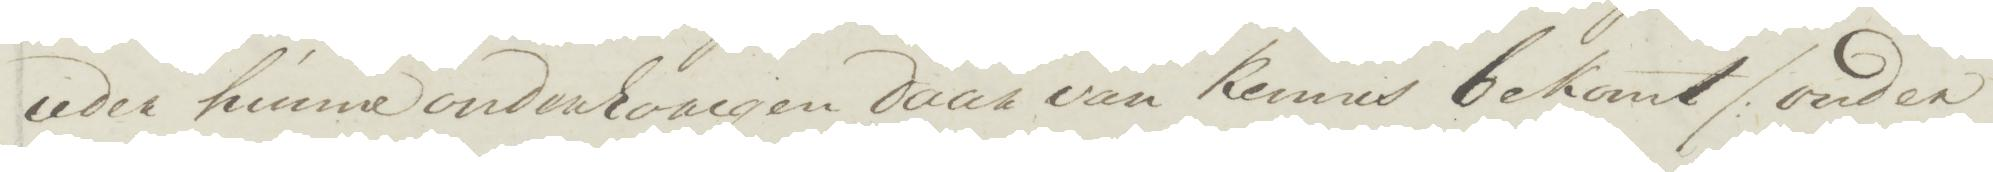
ieder hunne onderhorigen daar van kennis bekomt /:onder
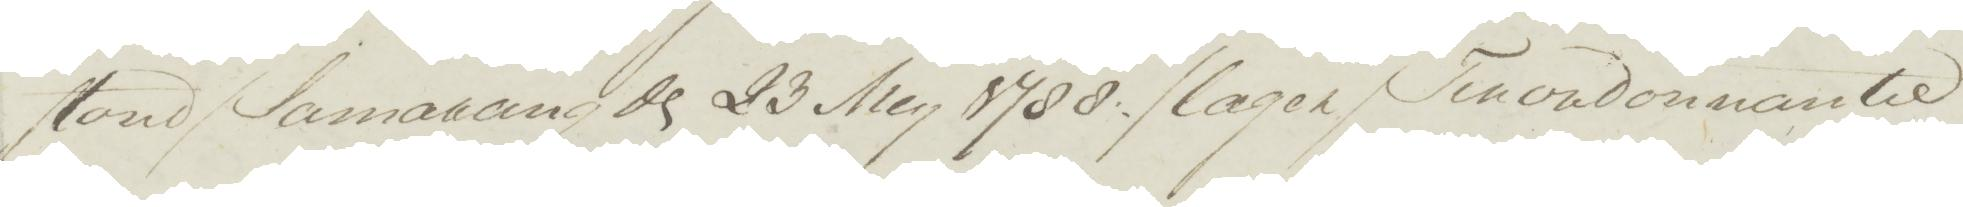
stond/ samarang den 23 Meij 1788: /lager./ Ter ordonnantie
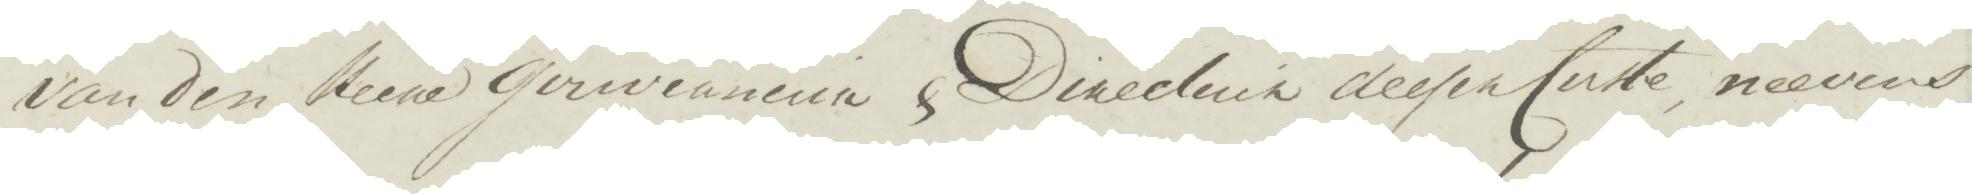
van den Heere gouverneur en Directeur deeser Custe, neevens
